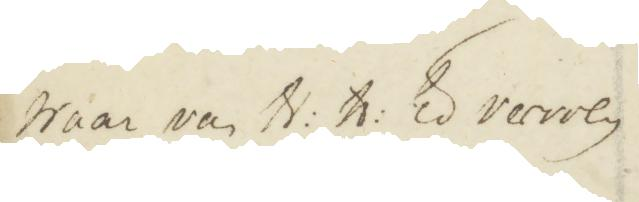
waar van H: H: Ed vervol
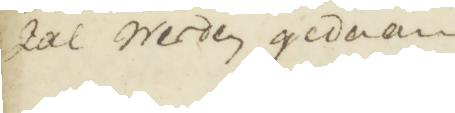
zal werden gedaan
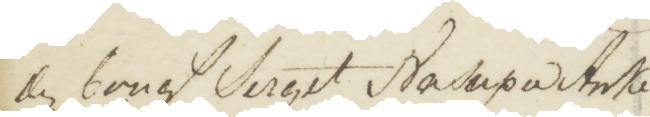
den bougs serget Nasapa Anke
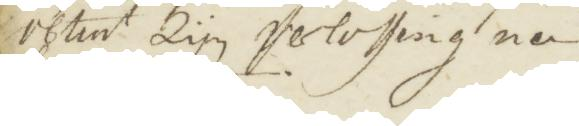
obtint zijn verlossing na
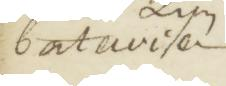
batavije
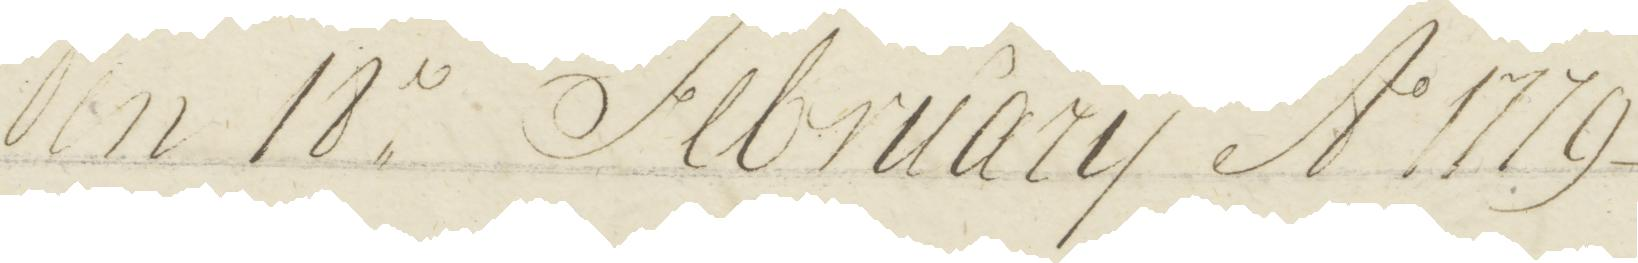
den 18„e Februarij Ao 1779
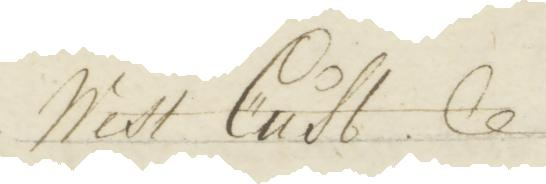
West Cust.
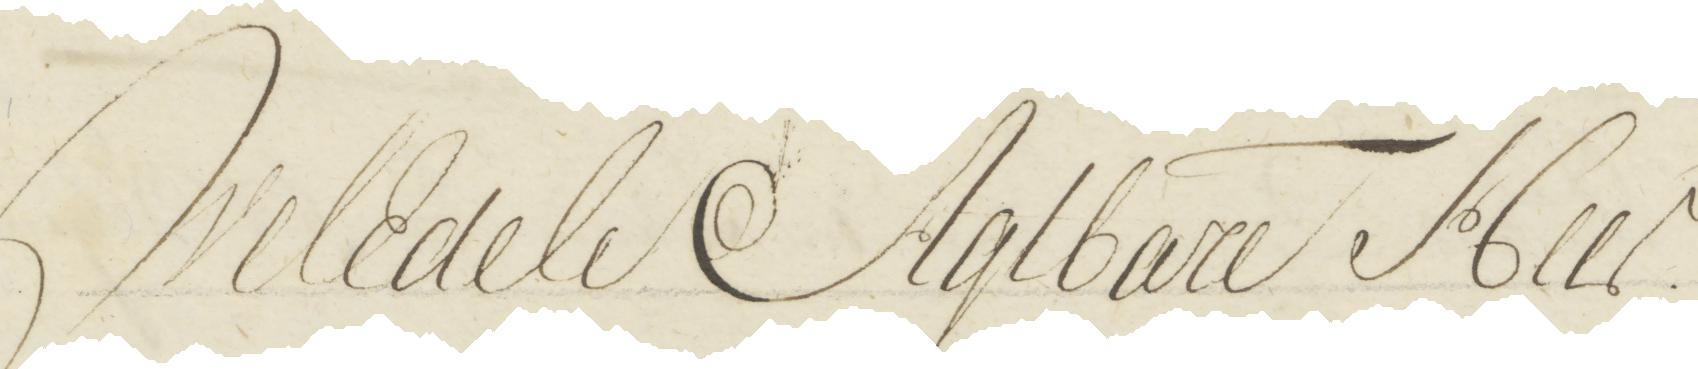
WelEdele Agtbare Heer.
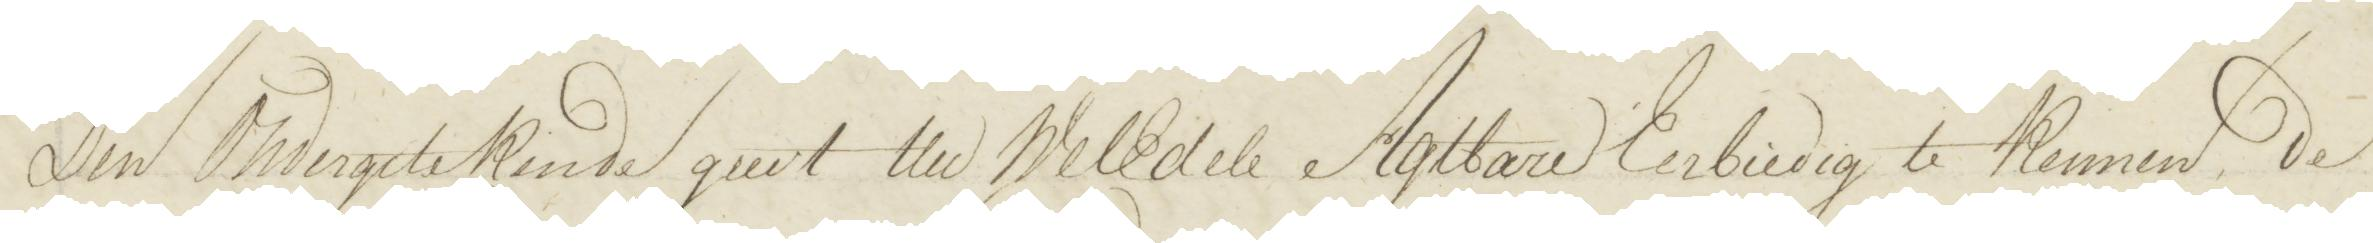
Den Ondergetekende geevt uw WelEdele Agtbare Eerbiedig te kennen, de
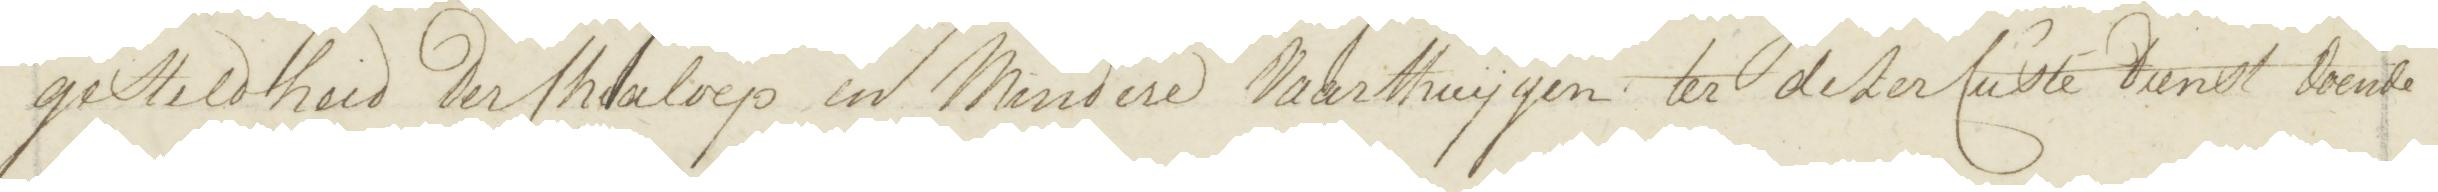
gesteldheid der Chialoep en Mindere Vaaerthuijgen ter dezer Custe dienst doende
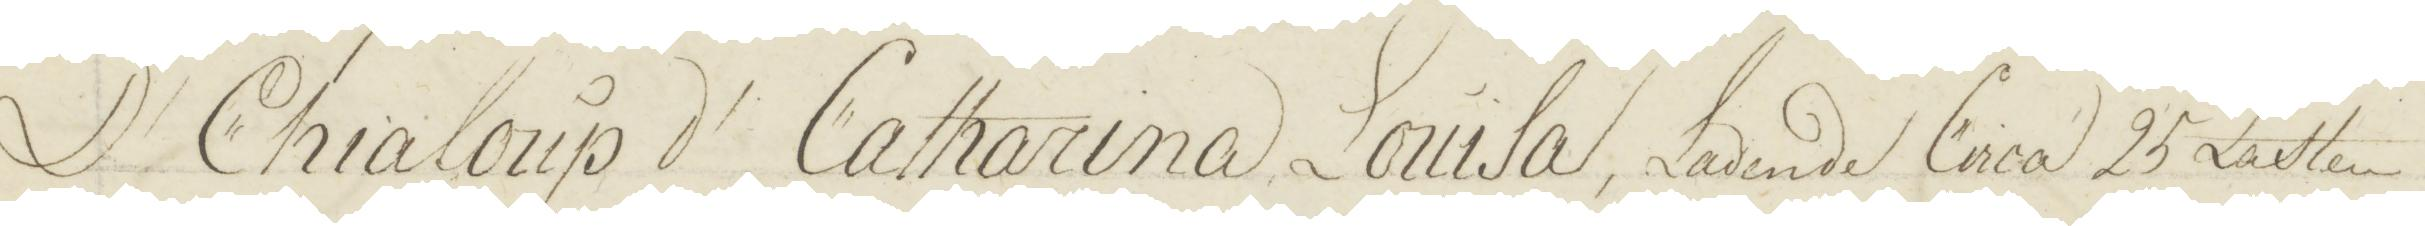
D'Chialoup d’ Catharina Louisa, Ladende Circa 25 Lasten
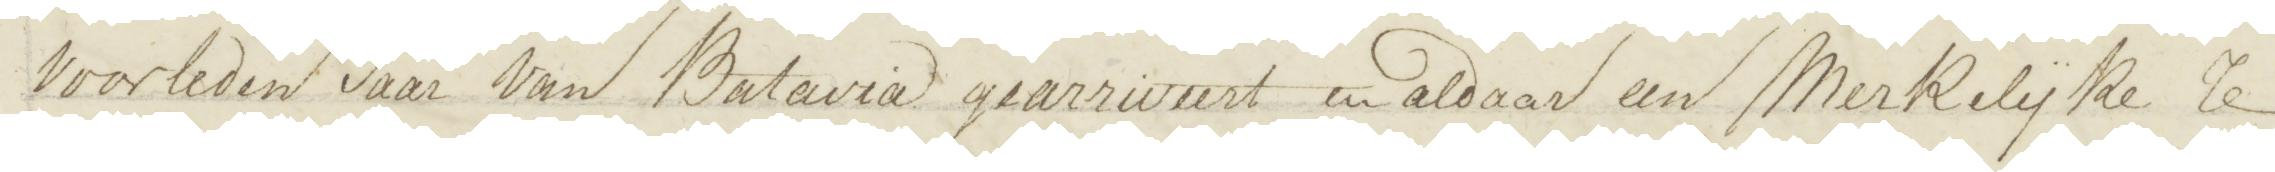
voorleden Jaar van Batavia gearriveert en aldaar een Merkelijke re
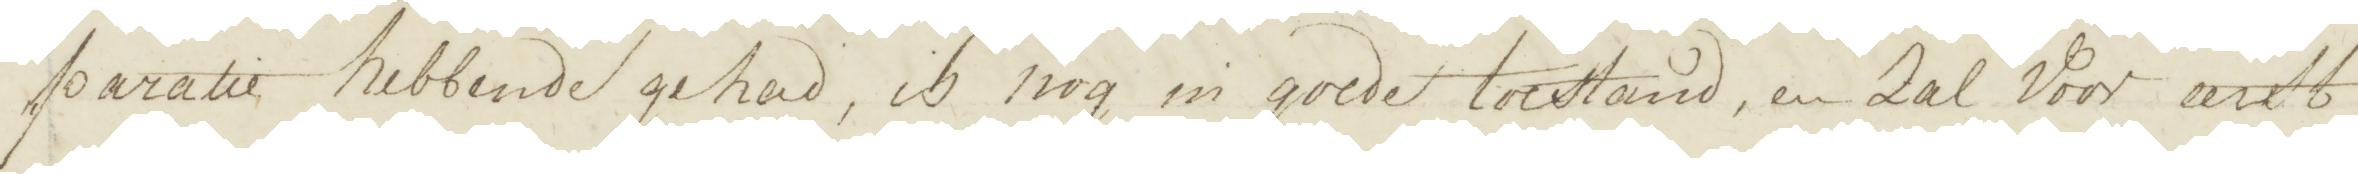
paratie hebbende gehad, is nog in goede toestand, en zal voor eerst
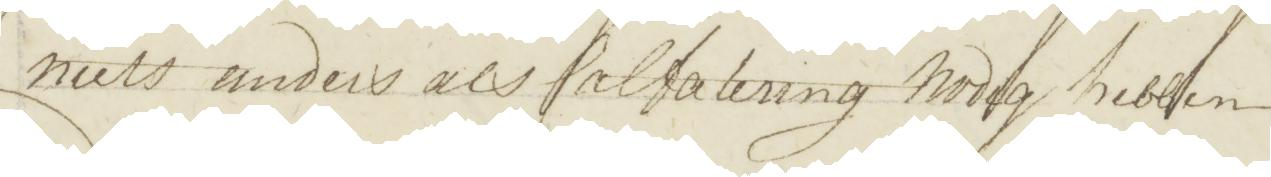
niets anders als Calfatering nodig hebben.
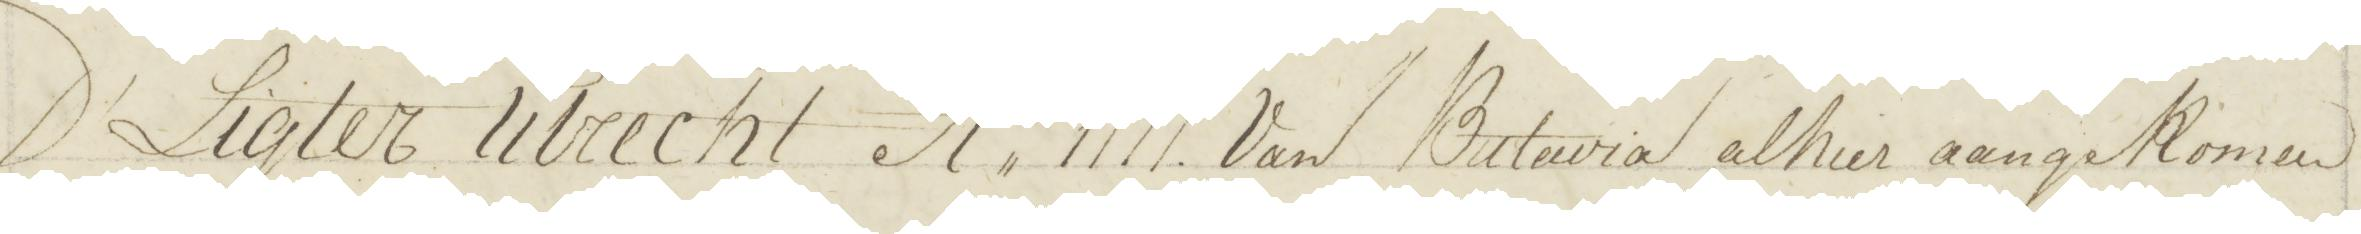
D'Ligter Utrecht A„o 1777. Van Batavia alhier aangekomen
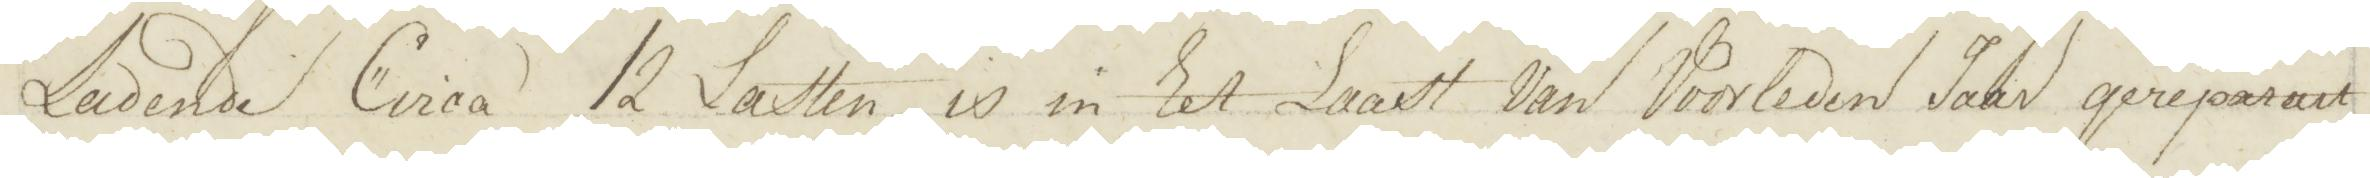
Ladende Circa 12 Lasten, is in het Laast van Voorleden Jaar gerepareert
